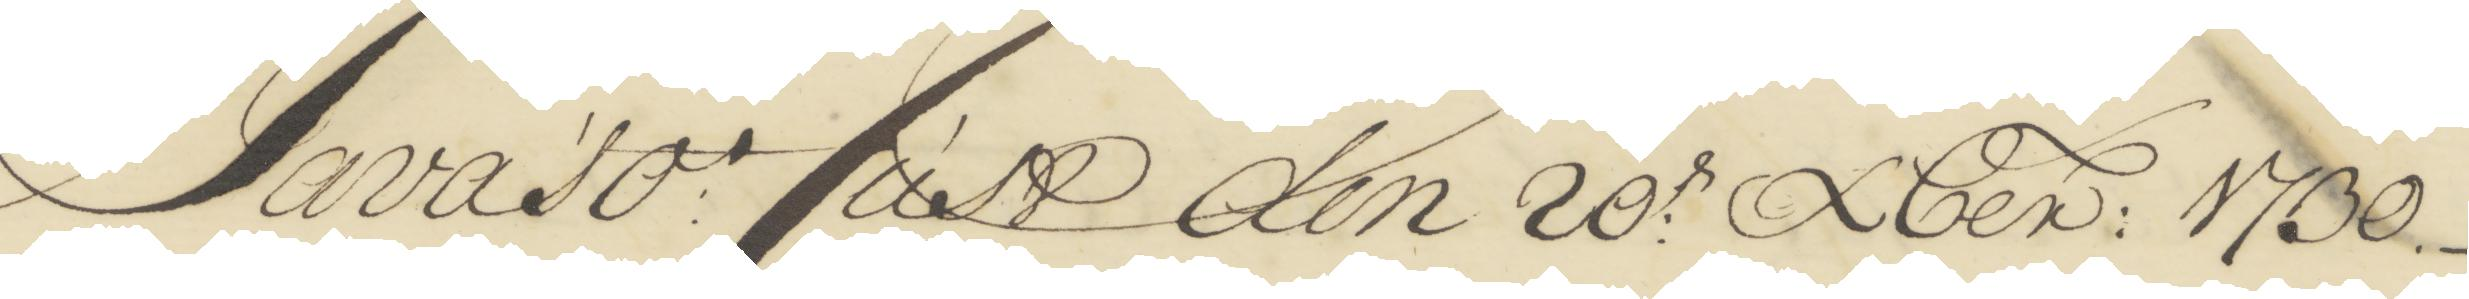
Java 'SO:t Cust den 20:en xber: 1730.
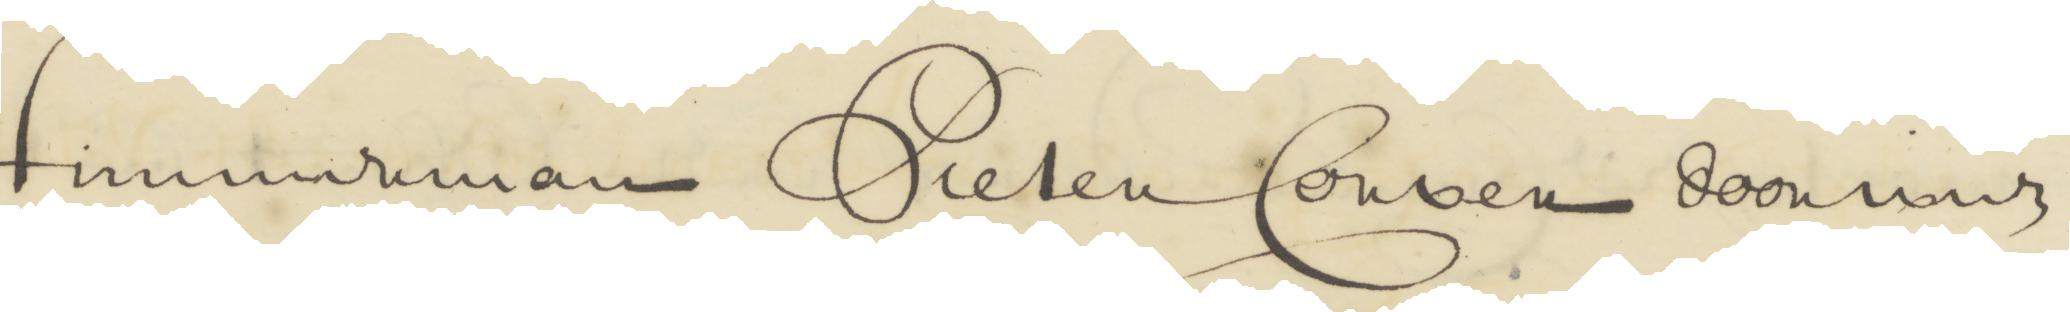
timmerman Pieter Corver door wien
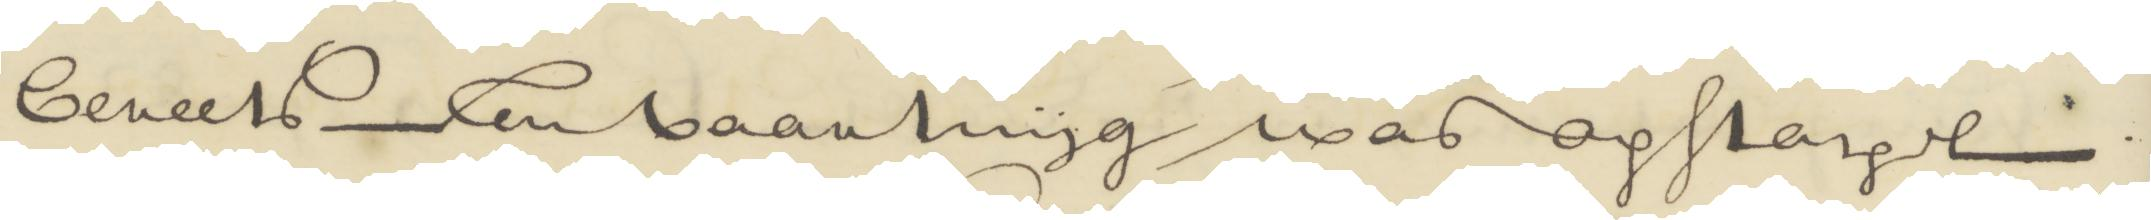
bereets Een vaartuijg was opstapel
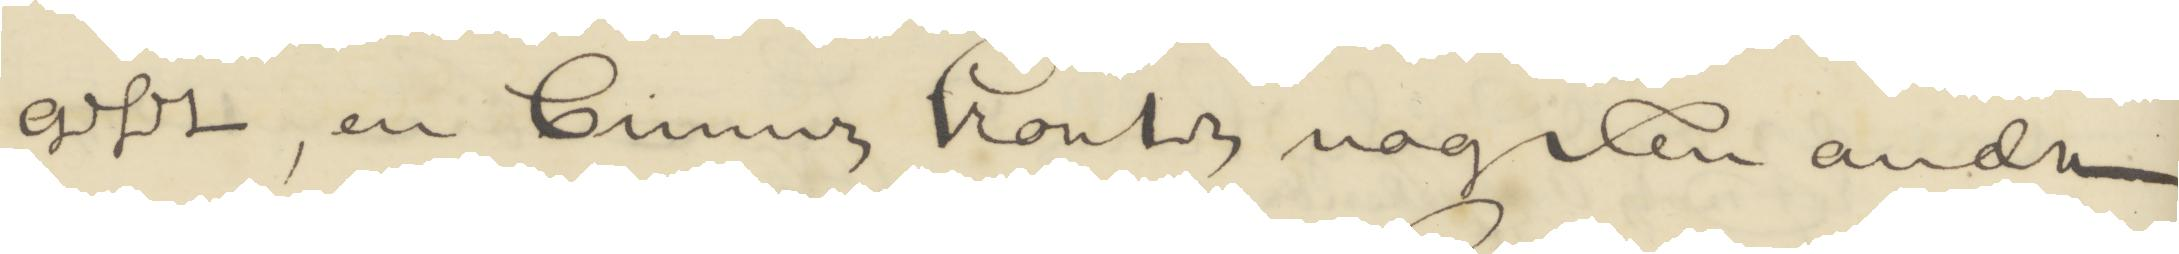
geset, en binnen korten nog Een ander
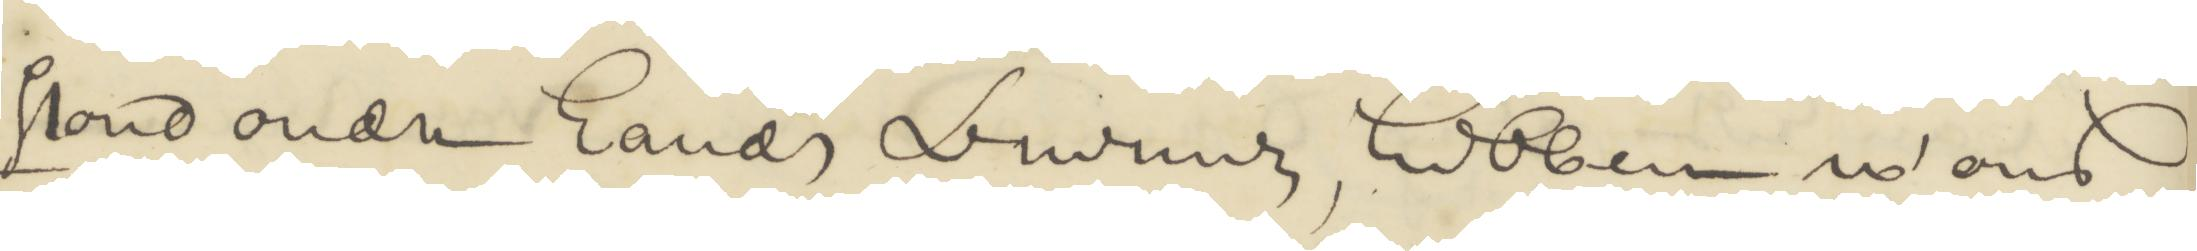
stond onder handen tenemen, hebben w'ons
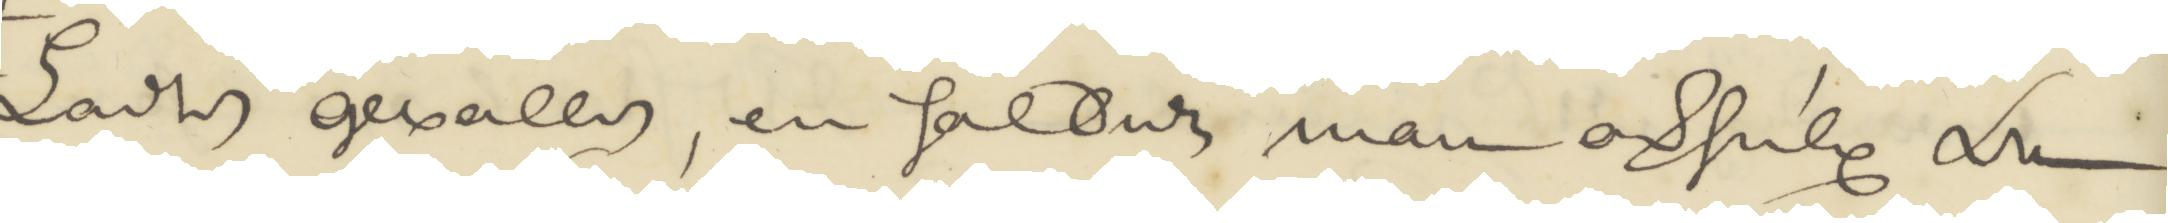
Laeten gevallen, en saldien man oversulx ter
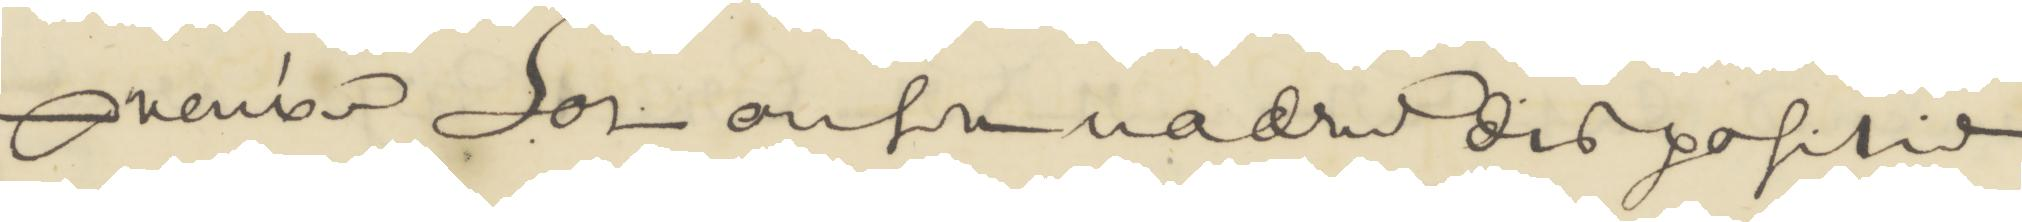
preuve Tot onser nadere dispositie
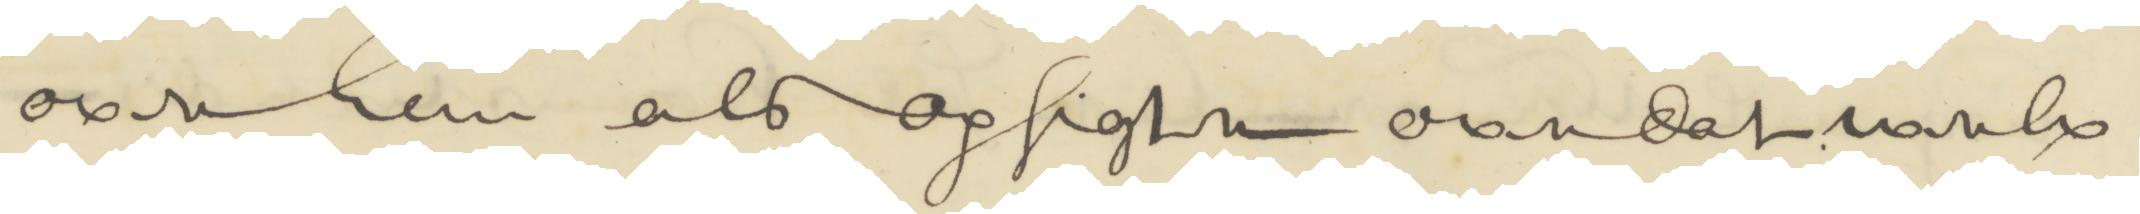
over hem als op sigter over dat werk
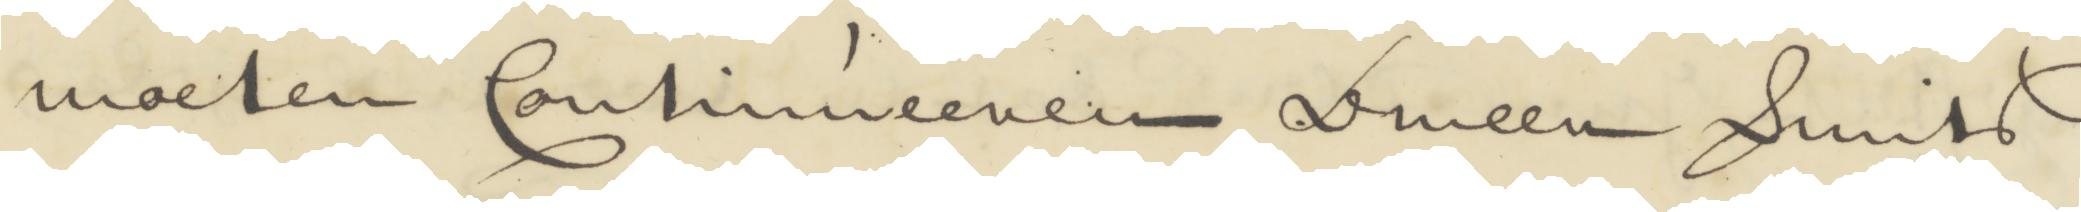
moeten Continueeren temeer vermits
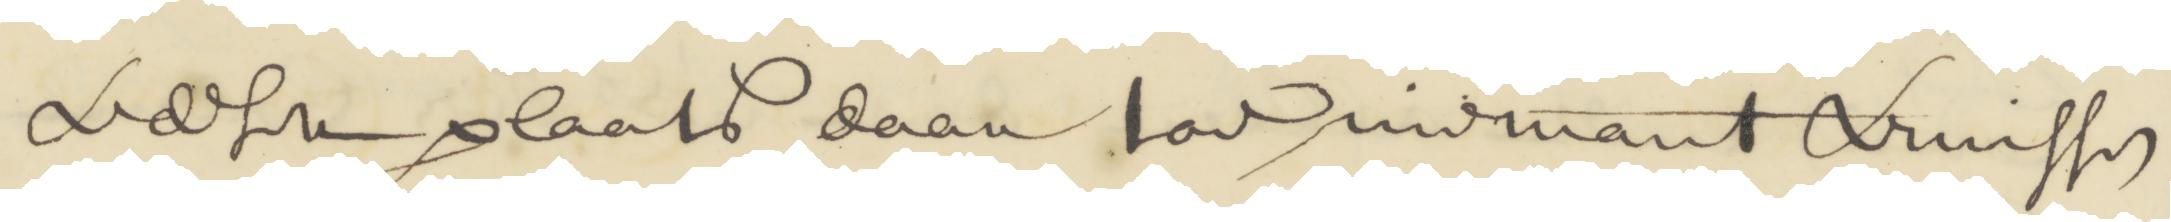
te deser plaats daar toe niemant temissen
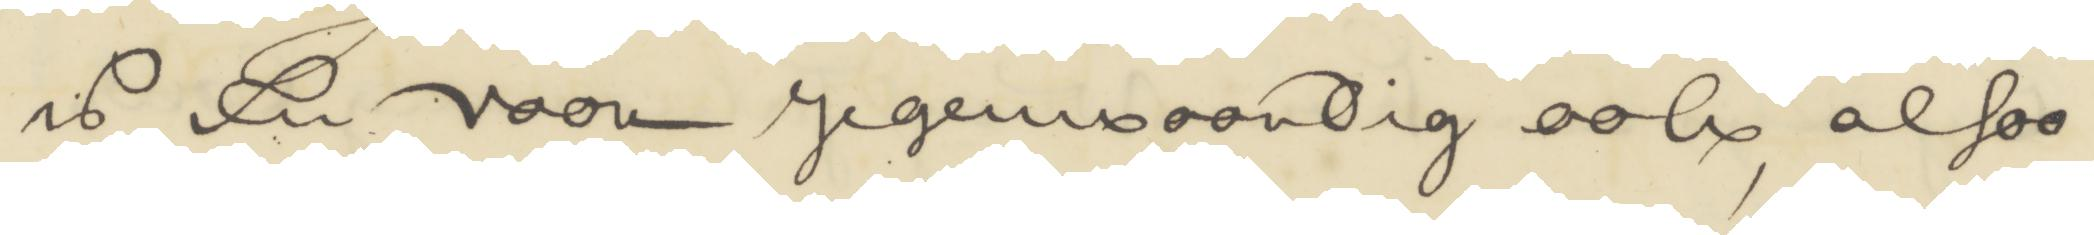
is, En voor jegenwoordig ook alsoo
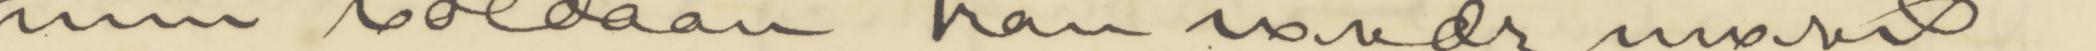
min voldaan kan werden uwer E
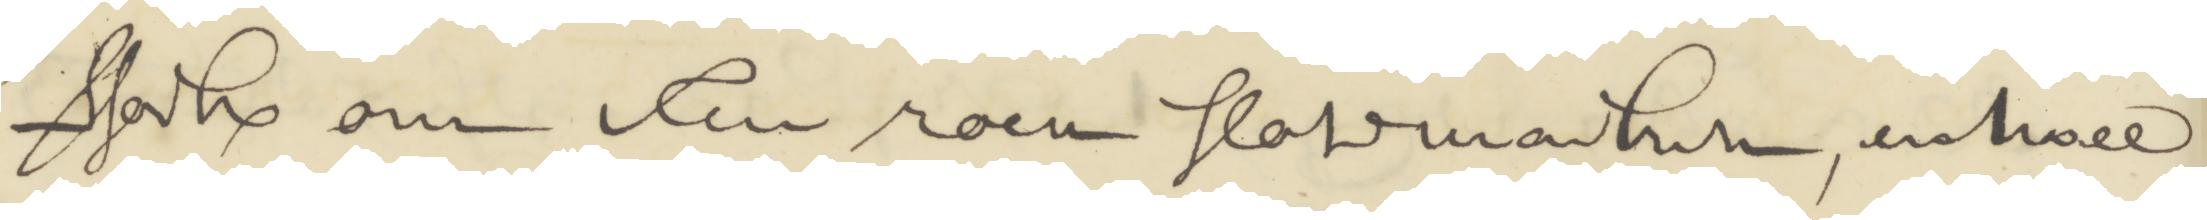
versoek om Een roerslote maeken, en twee
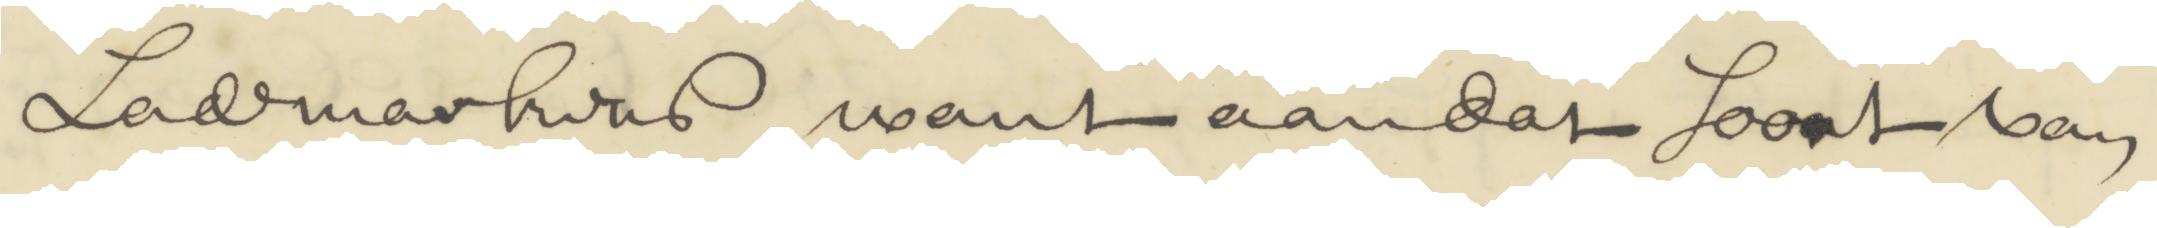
lademaekers, want aan dat soort van
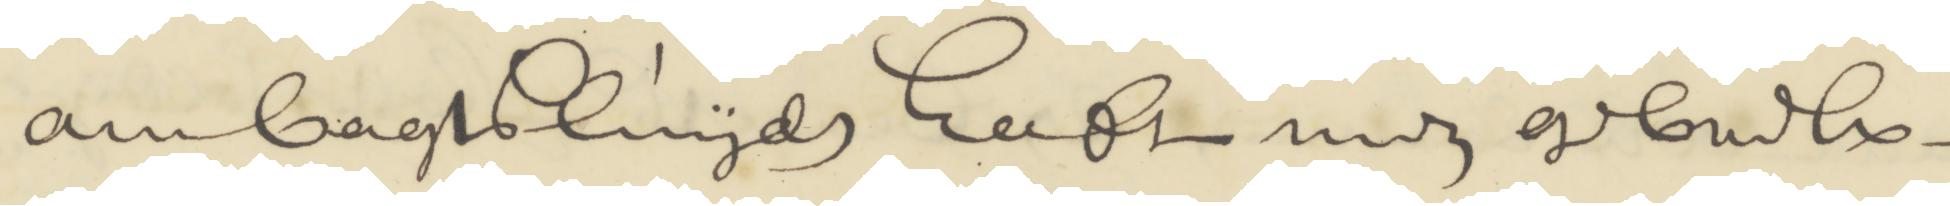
ambagtsluijden heeft men gebrek
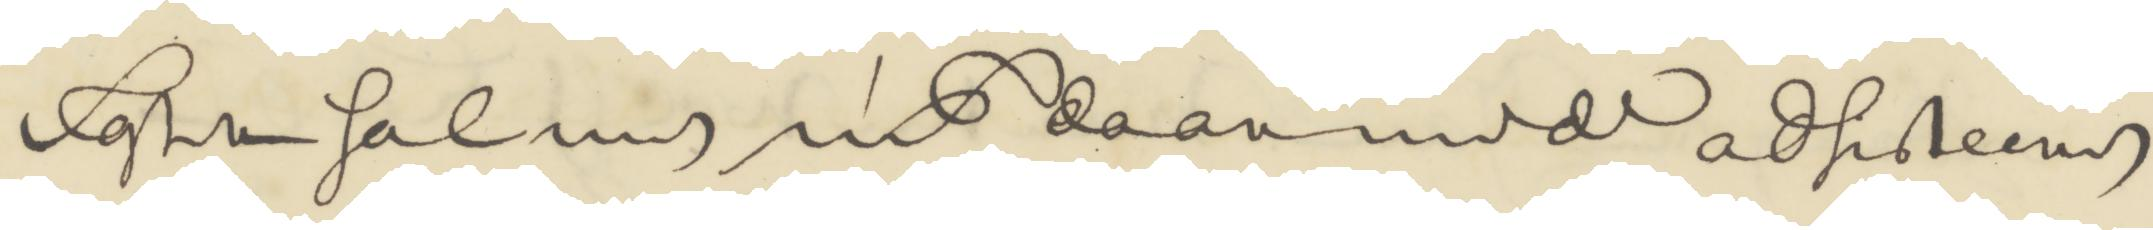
Egter sal men uE daar mede adsisteeren
